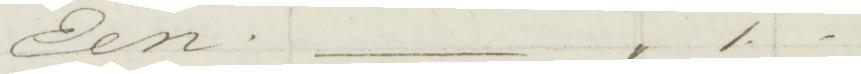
Een — „ 1 —
